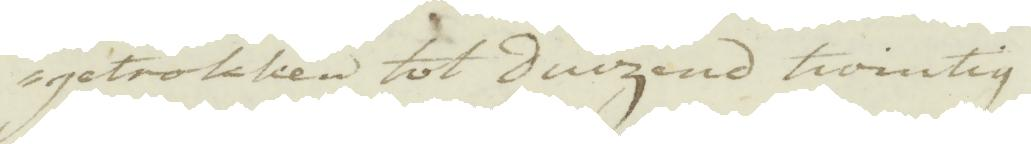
„getrokken tot duizend twintig
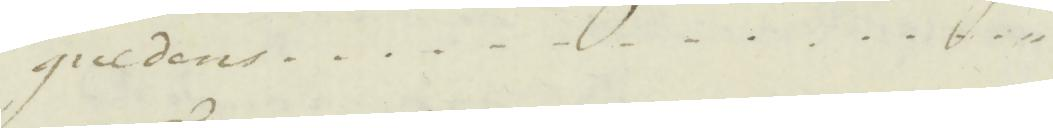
guldens . . . . . . . . . . . . . . „
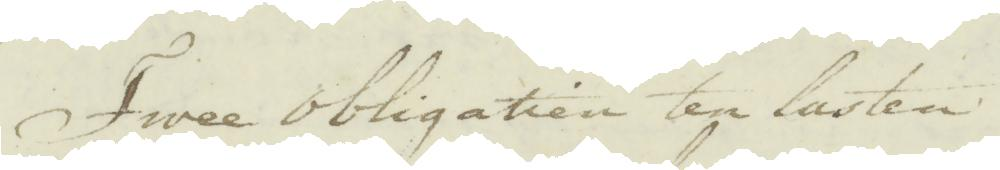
Twee obligatien ten lasten
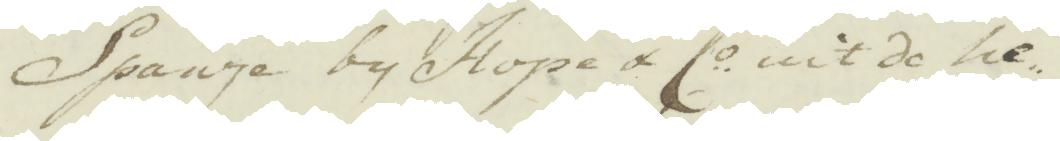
Spanje bij Hope & C:o uit de ne„
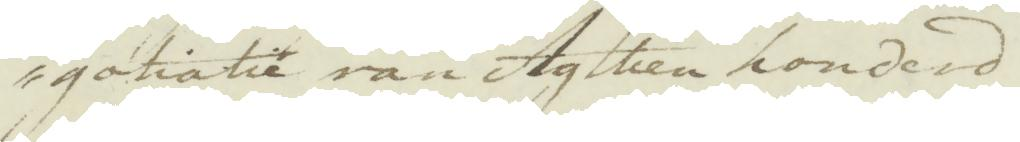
„gotiatie van Agttien honderd
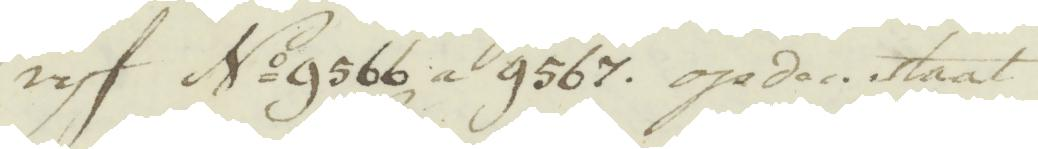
vyf N=o 9566 a 9567. op den staat
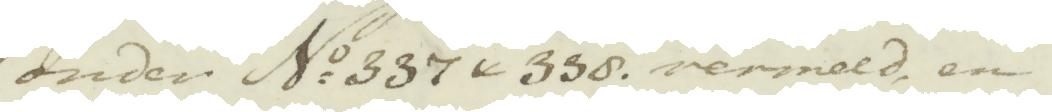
onder N=o 337 & 338. vermeld, en
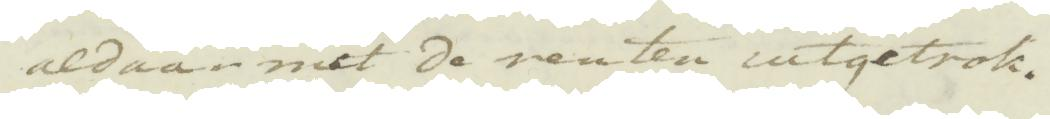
aldaar met de renten uitgetrok„
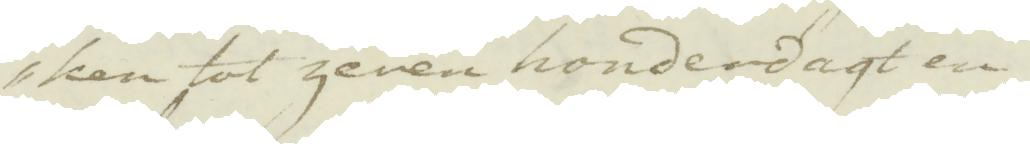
„ken tot zeven honderdagt en
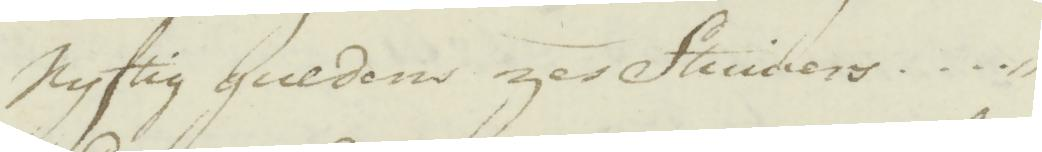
vyftig guldens zes Stuivers . . . .„
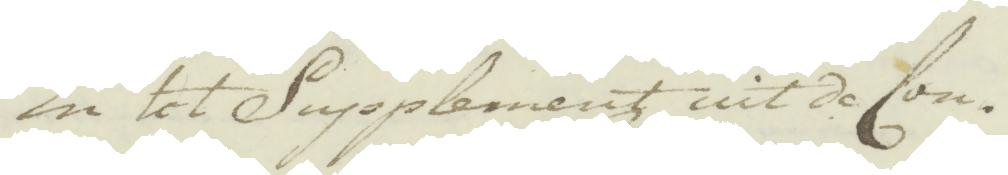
En tot Supplement uit de Con„
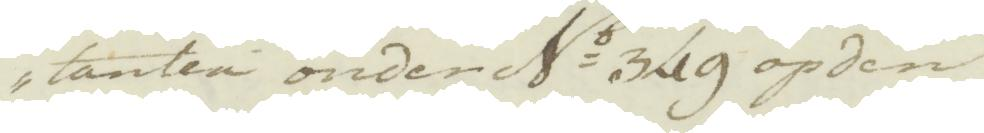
„tanten onder N=o 349 op den
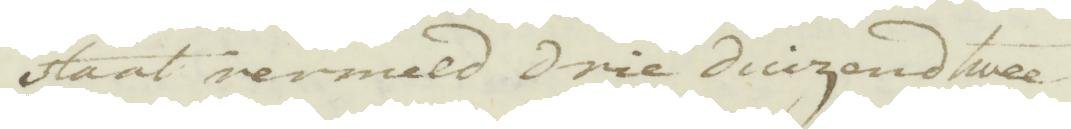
staat vermeld drie duizend twee
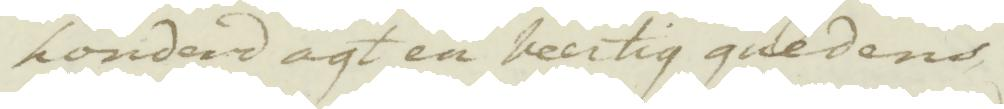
honderd agt en veertig guldens
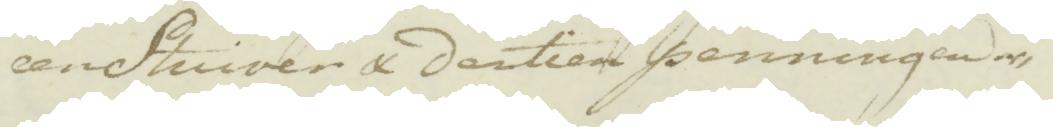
een Stuiver & dertien penningen .„
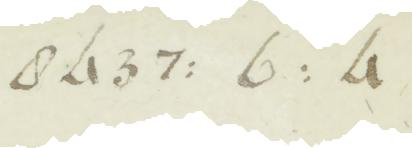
8437: 6: 4
